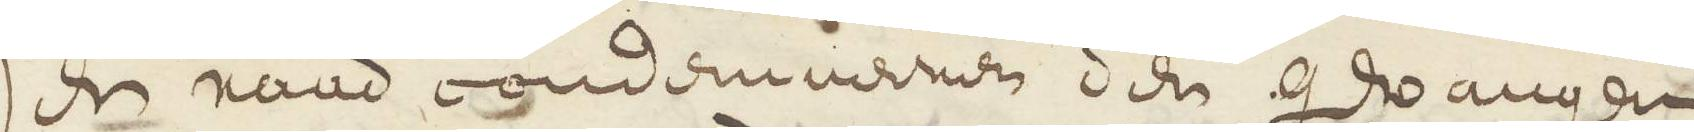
Den raad condemneeren den gevangen
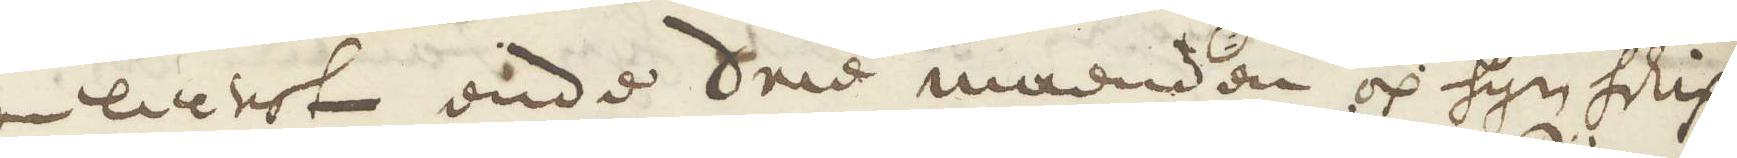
geleerst ende drie maenden op sijn schip
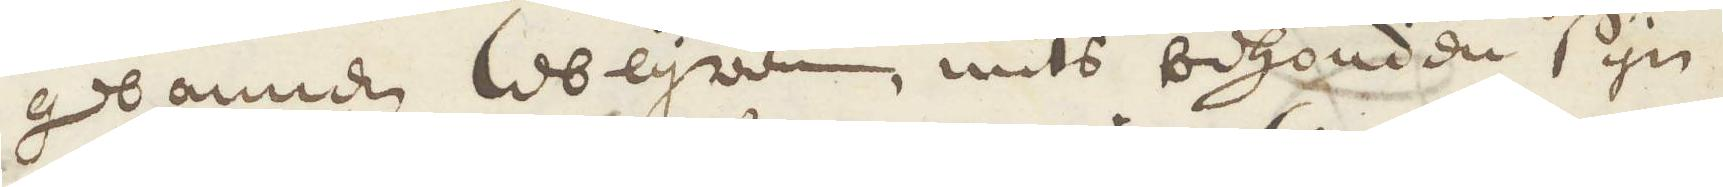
gebannen teblijven, mits behouden sijn
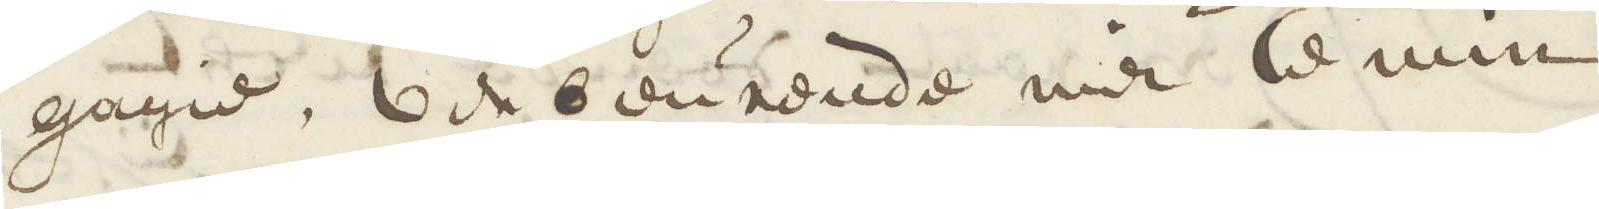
gagie, verbeurende niet te min
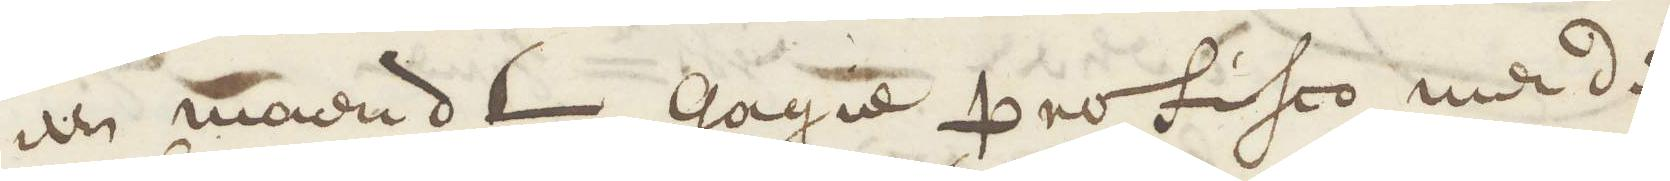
een maendt gagie profisco met de
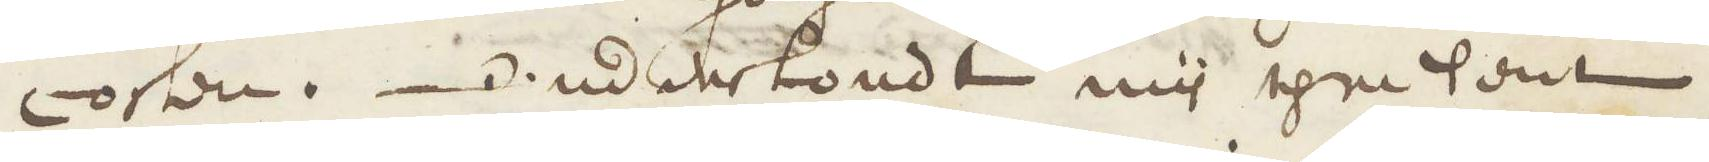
costen. Onderstondt mij present
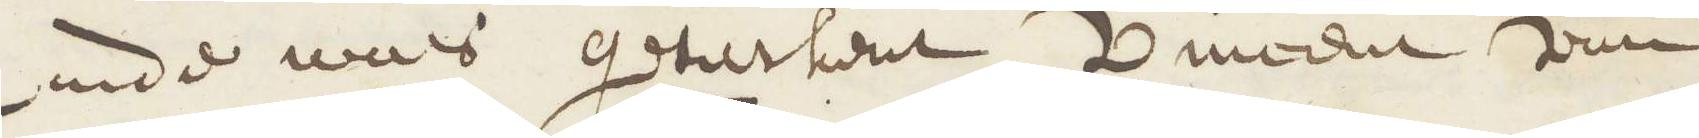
ende was geteekent Vincent van
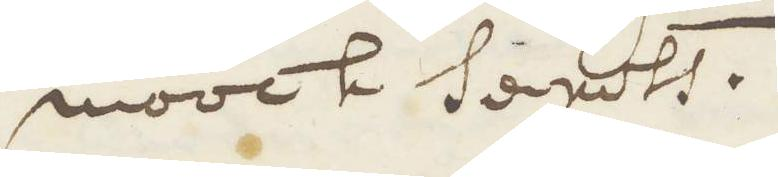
moock secrets.
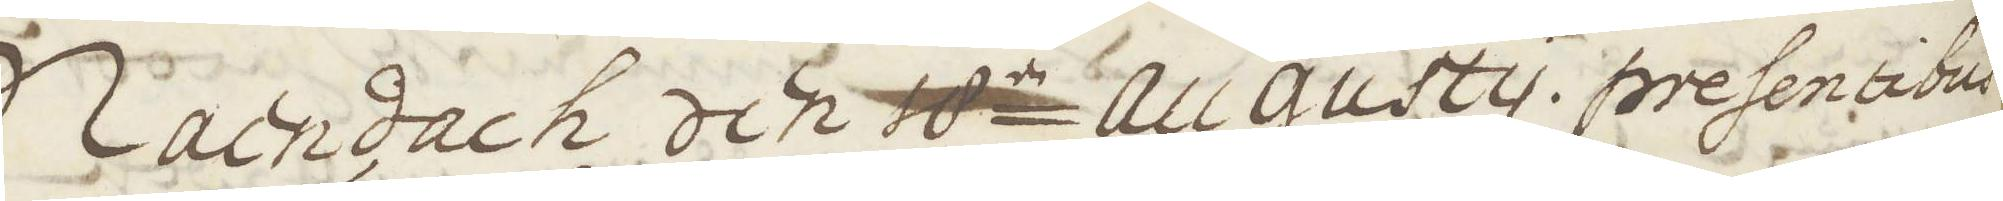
Maendach den 18=en augustij. presentibus
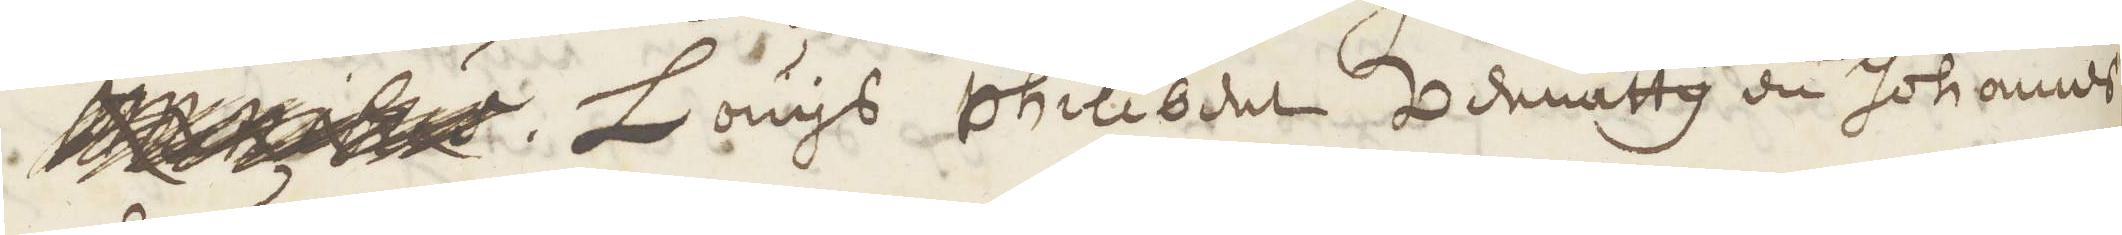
Omnibus. Louijs philibert Vennattij en Johannes
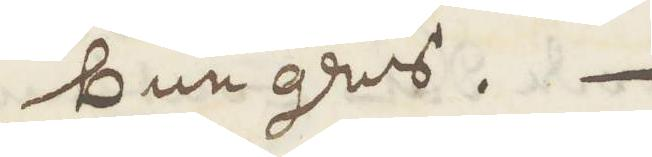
burgers. —
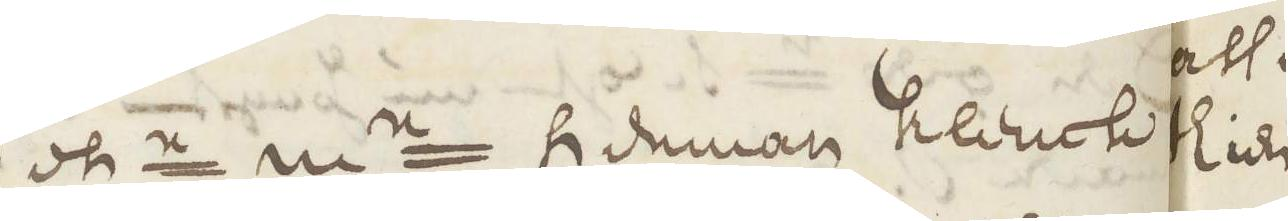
Deh=r m=r herman klenck
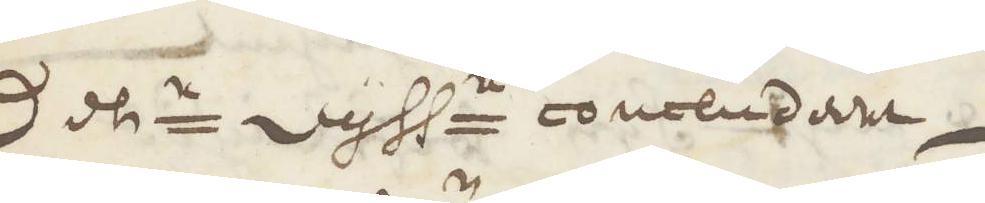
Deh=r Eijss=r concludeert
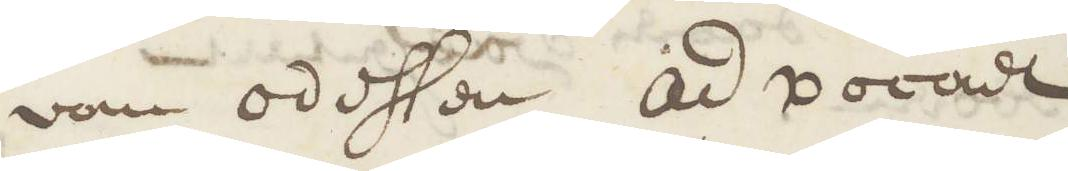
van odessen ad vocaet
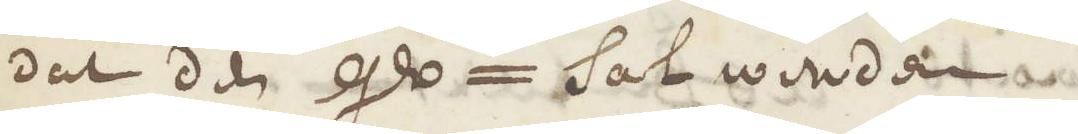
dat den gev=n sal werden
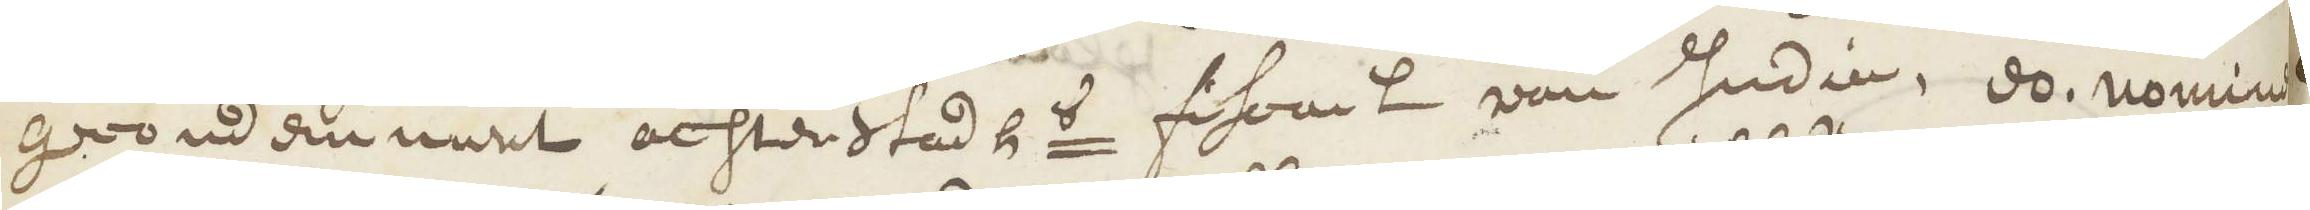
gecondemneert achter stadh=s fiscael van Jndia, eo. nomin
